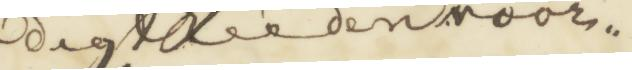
digt heeden voor„
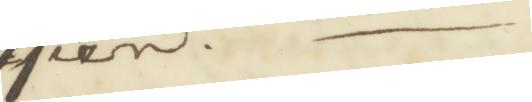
fien. —
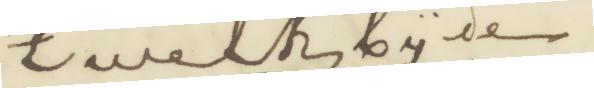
't welk bij de
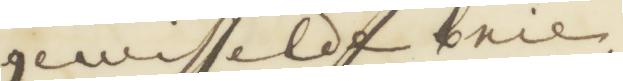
gewisselde brie„
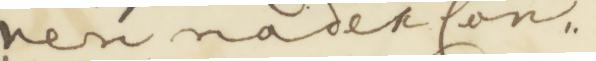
ven nader Con„
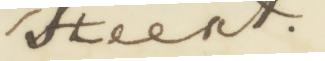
steert.
